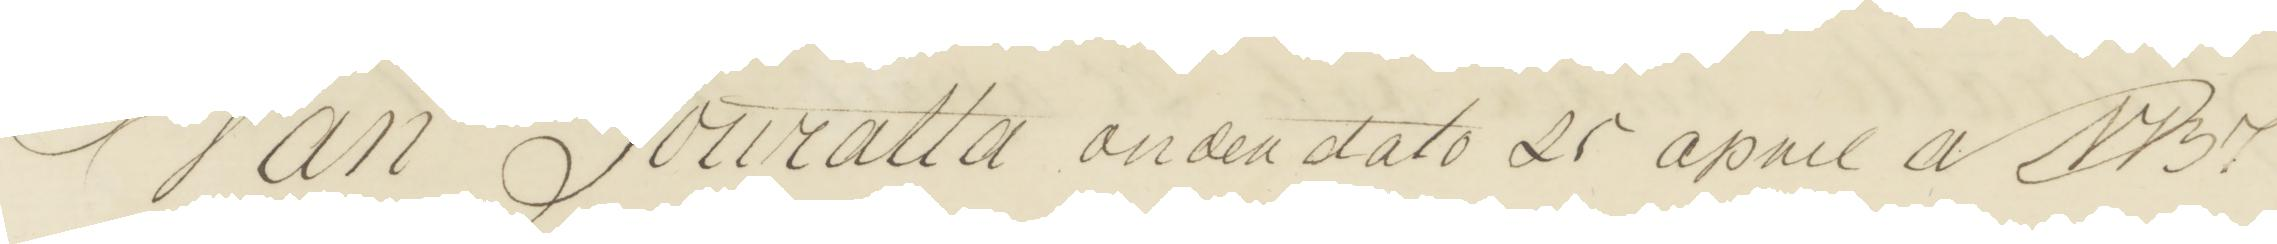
Van Souratta onder dato 25 april a 1737
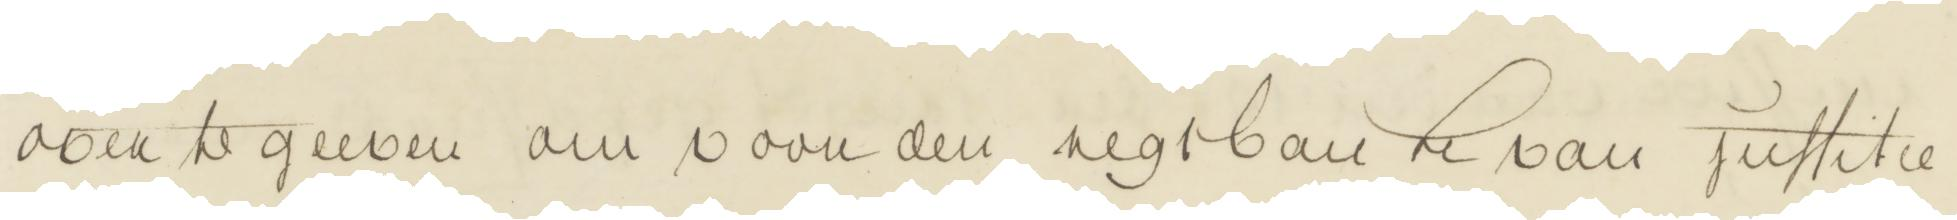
over te geeven om voor den regtbank van justitie
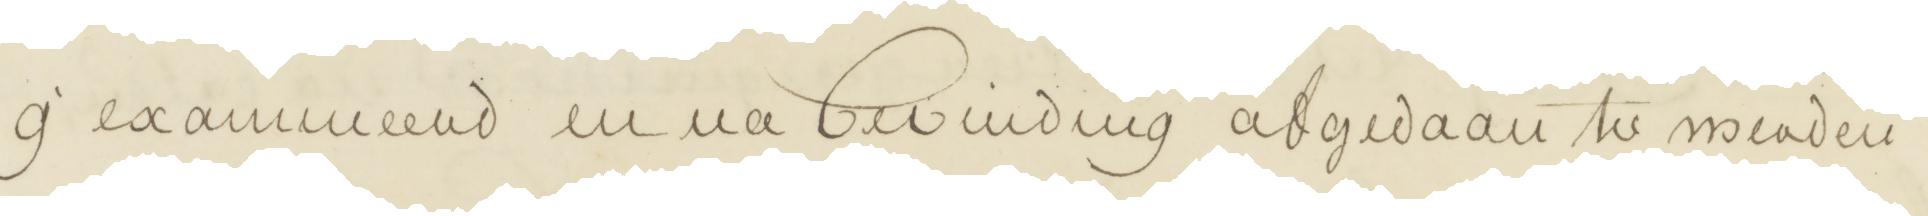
g’examneerd en na bevinding afgedaan te werden
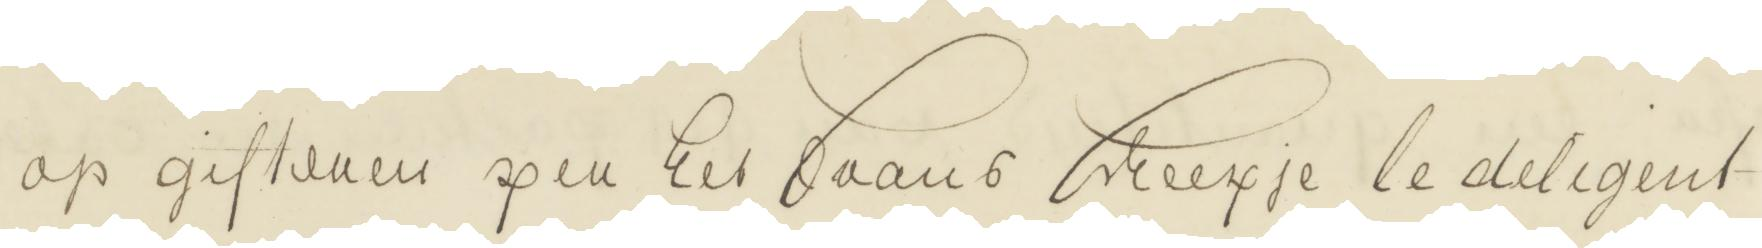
op gisteren per het Frans Scheepje le deligent
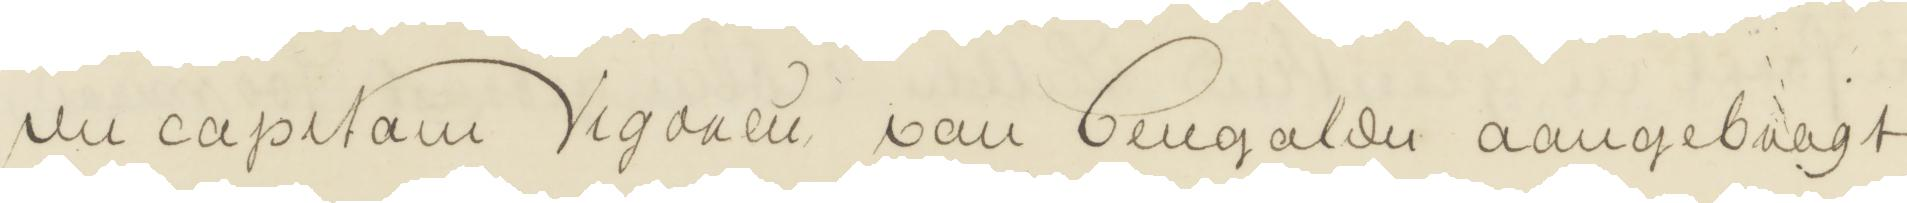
en capitain Vigoreu van bengalen aangebragt
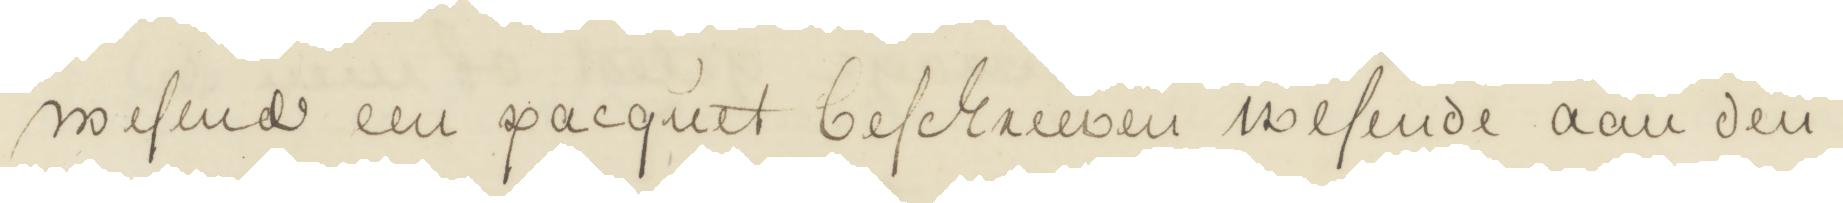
wesende een pacquet beschreeven wesende aan den
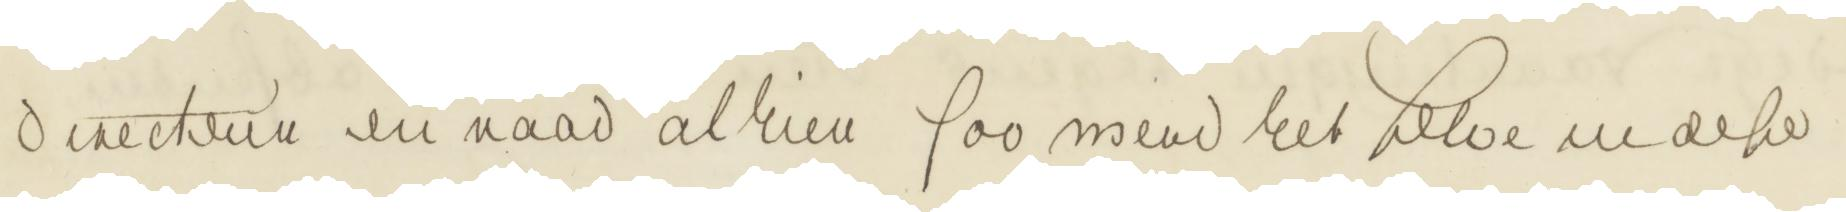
directeur en raad alhier soo werd het Selve in dese
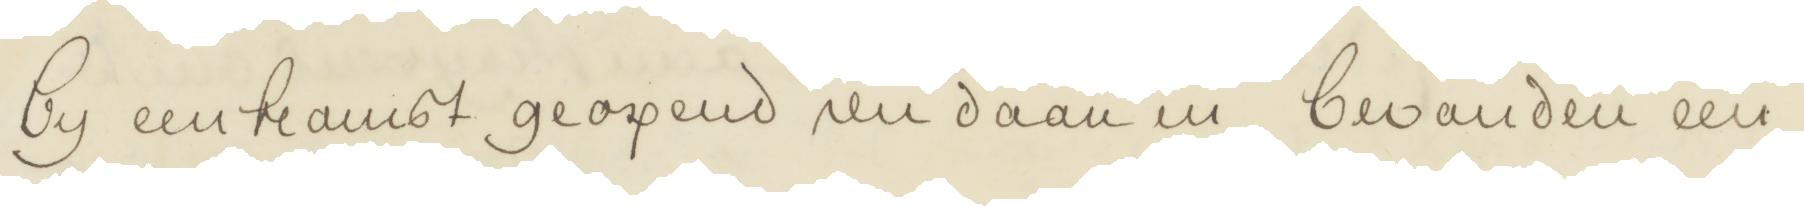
by een kamst geopend en daar in bevanden een
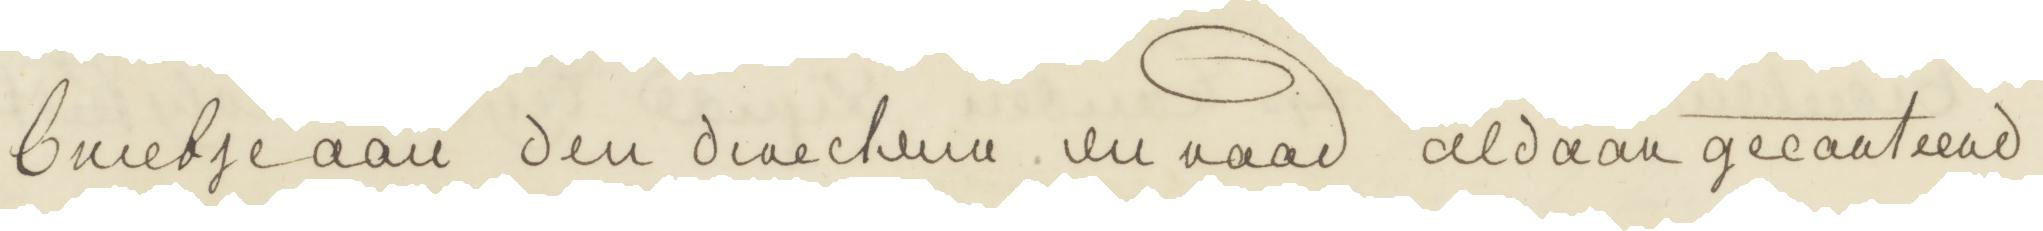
briefje aan den directeur en raad aldaar gecarteerd
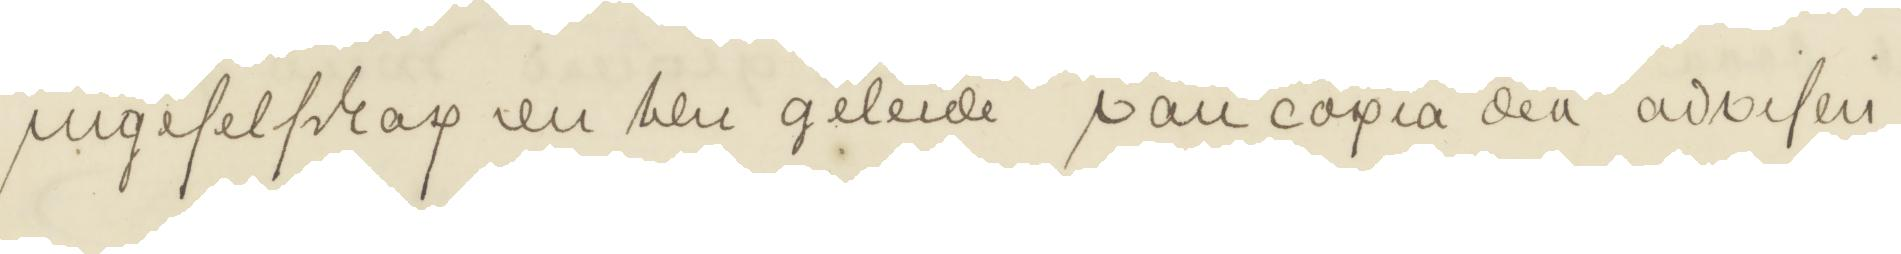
ingeselschap en ten geleide van copia der advisen
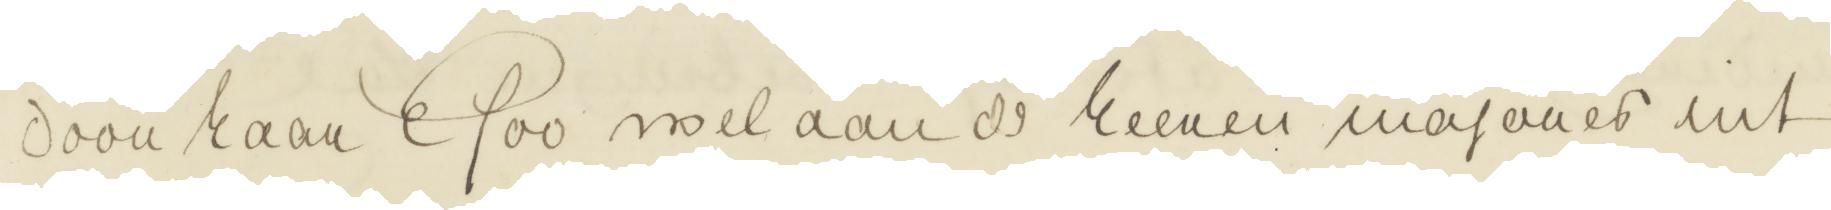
door haar E soo wel aan de heeren majores int
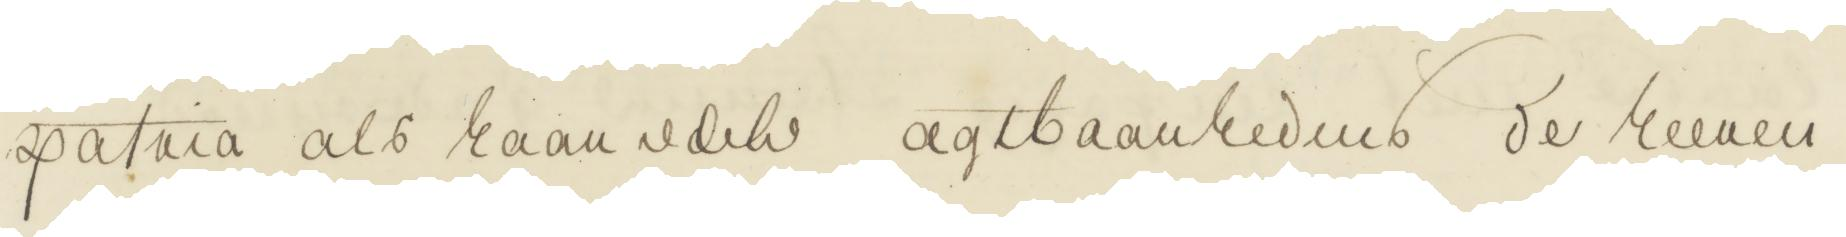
patria als haar edele agtbaarhedens de heeren
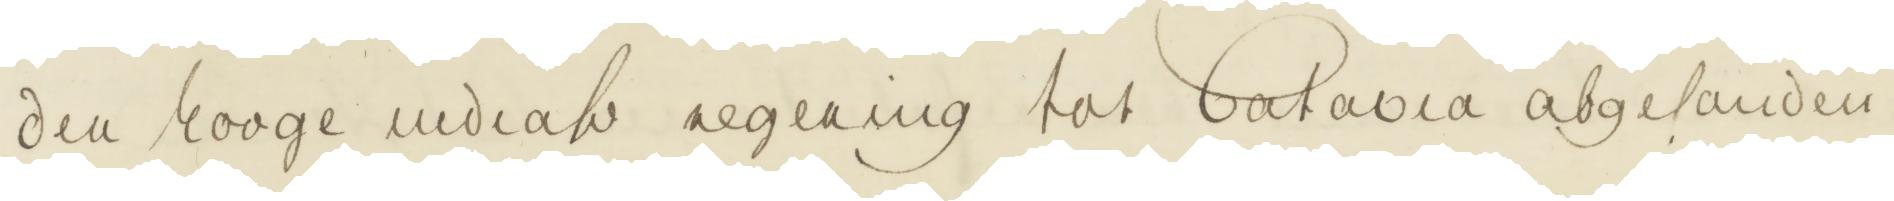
den hooge indiase regering tot batavia abgesanden
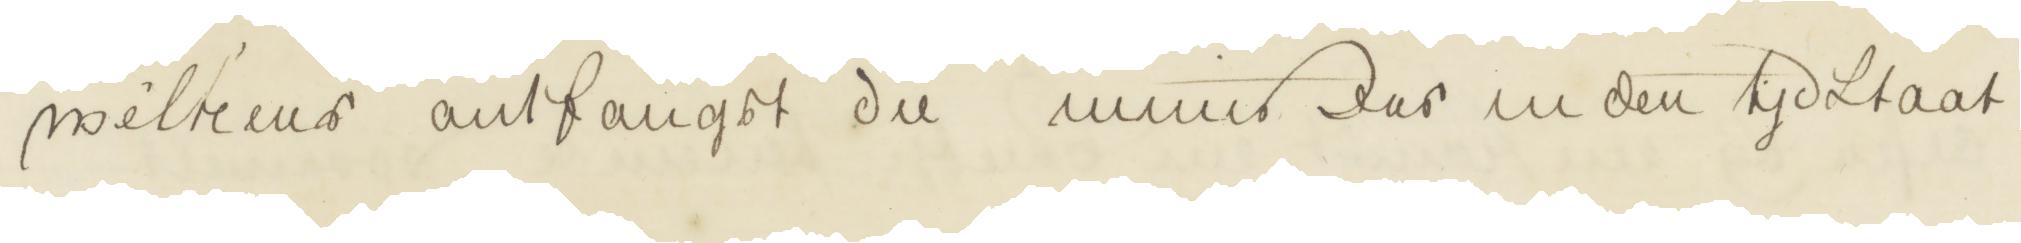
welkens ontfangst die ministers in den tijd staat
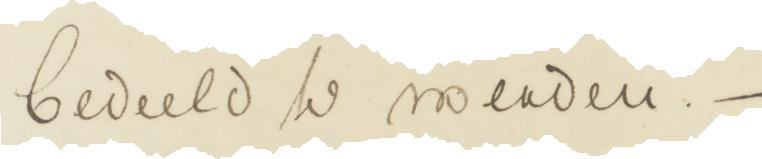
bedeeld te werden. —
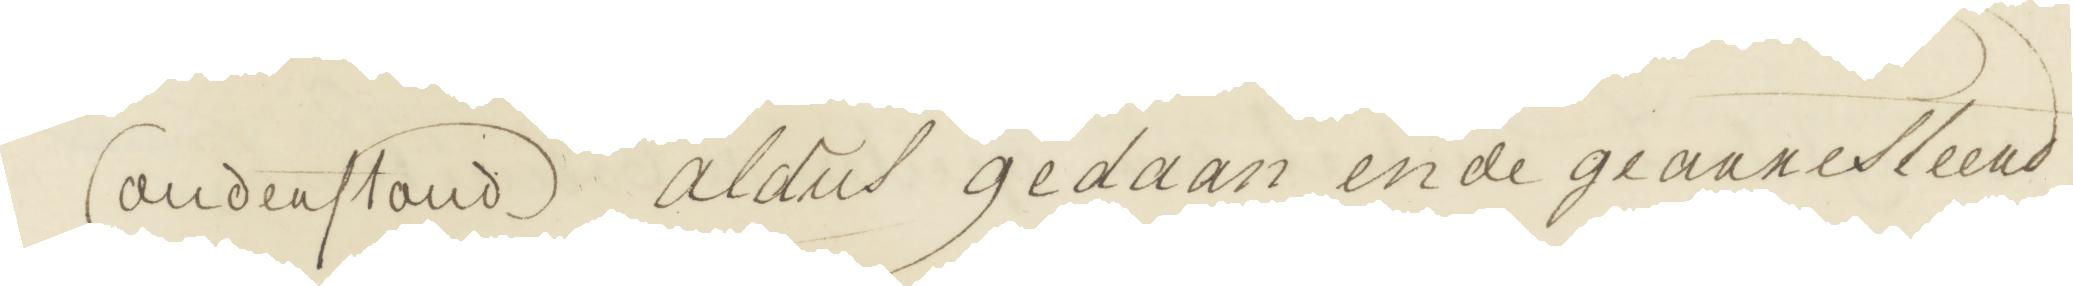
(onderstond) aldus gedaan en de gearresteerd
